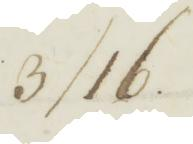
3/16.
